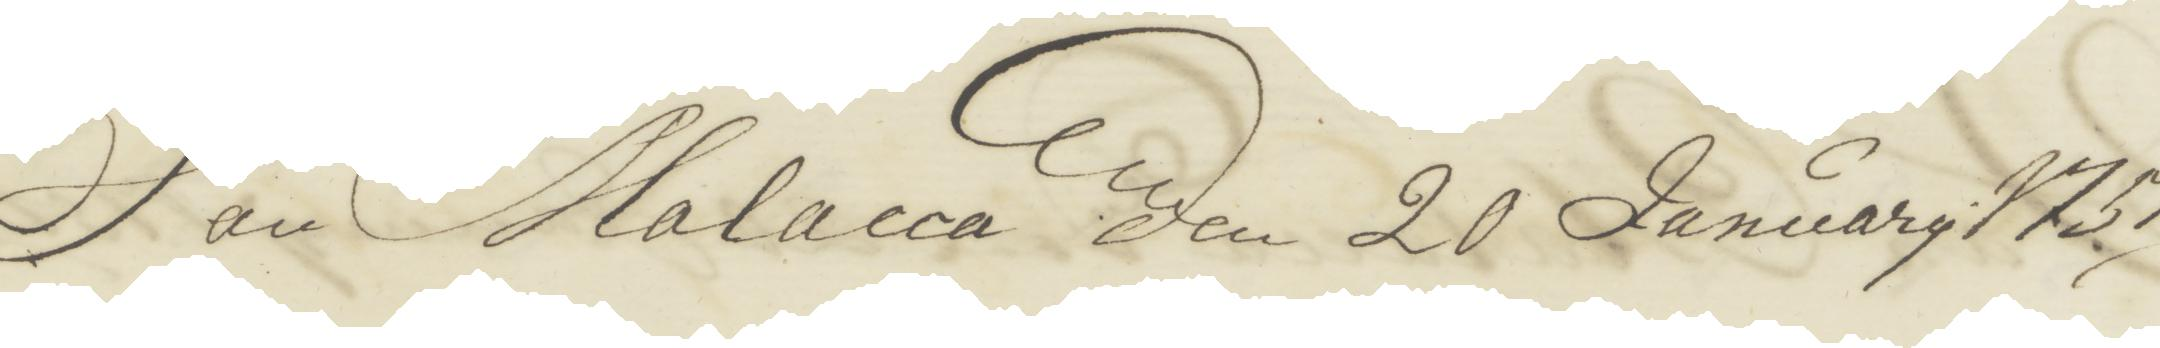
Van Malacca den 20 Ianuarij 175
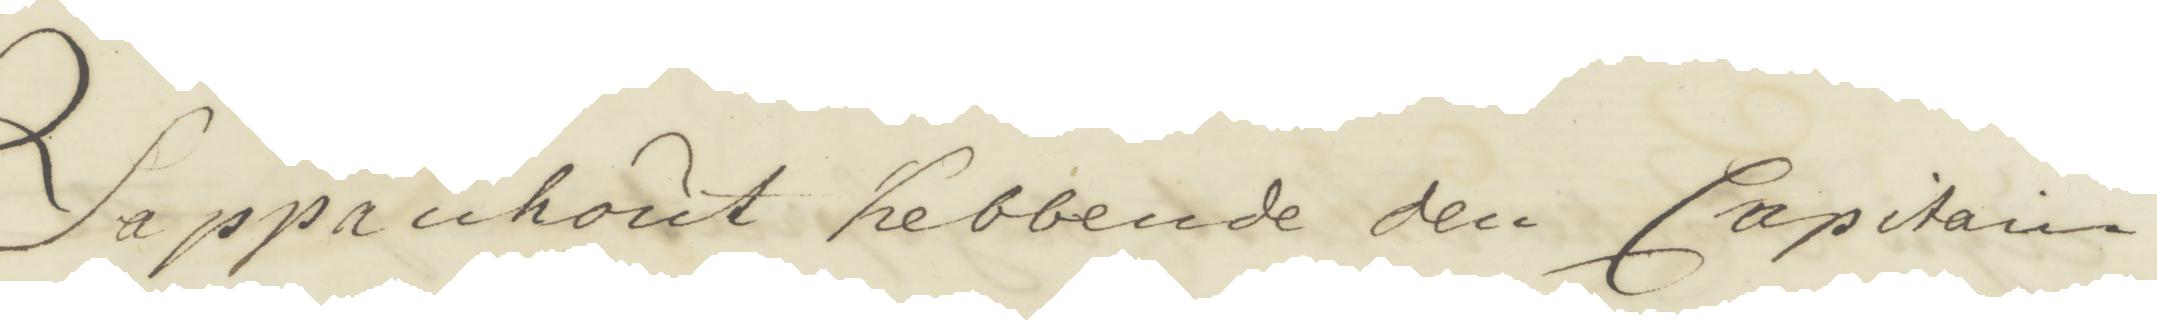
Sappanhout hebbende den Capitain
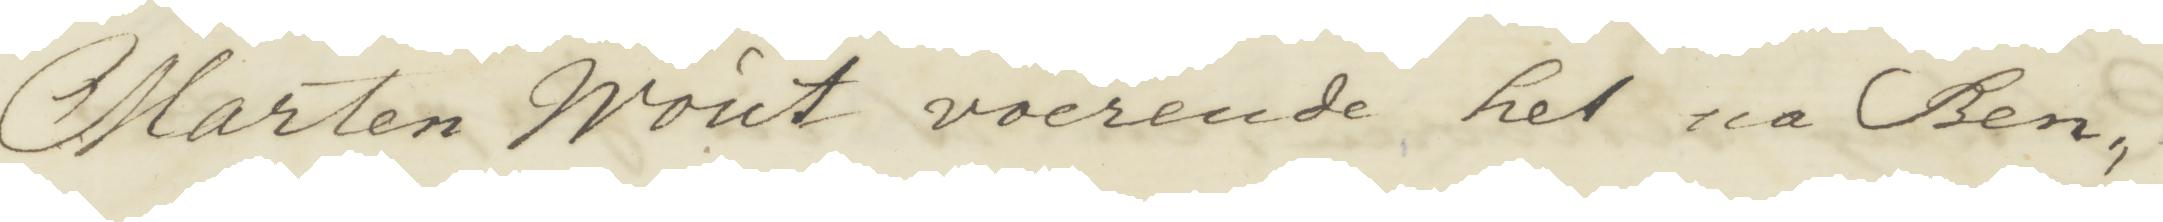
Marten Wout voerende het na Ben„
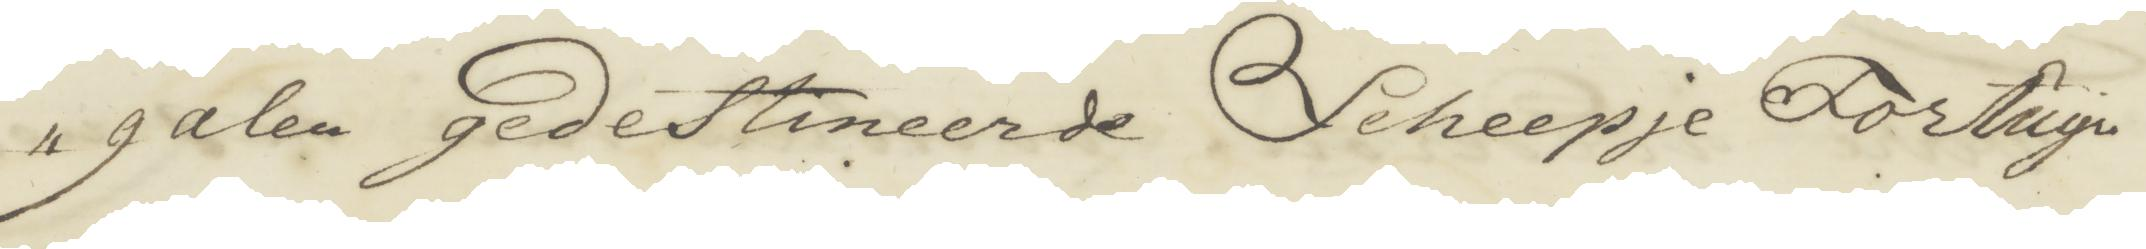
„galen gedestineerde scheepje Fortuijn
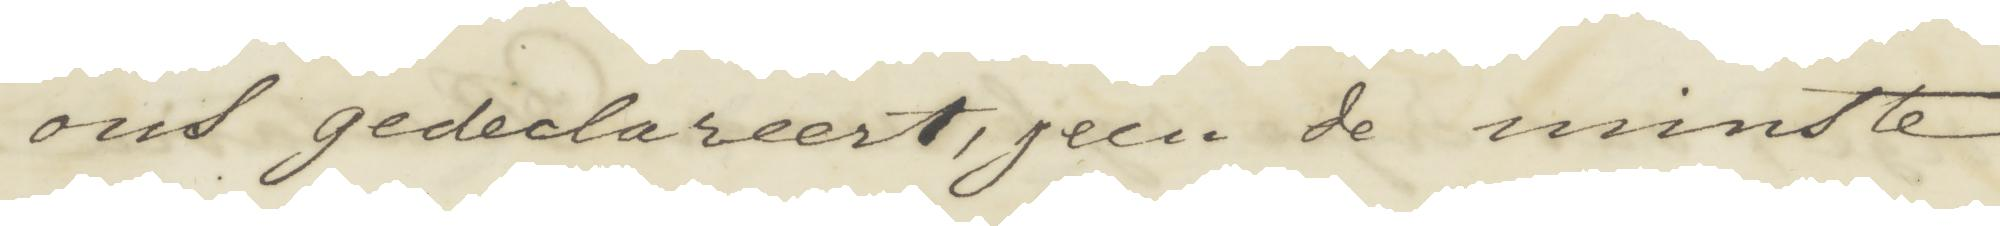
ons gedeclareert, geen de minste
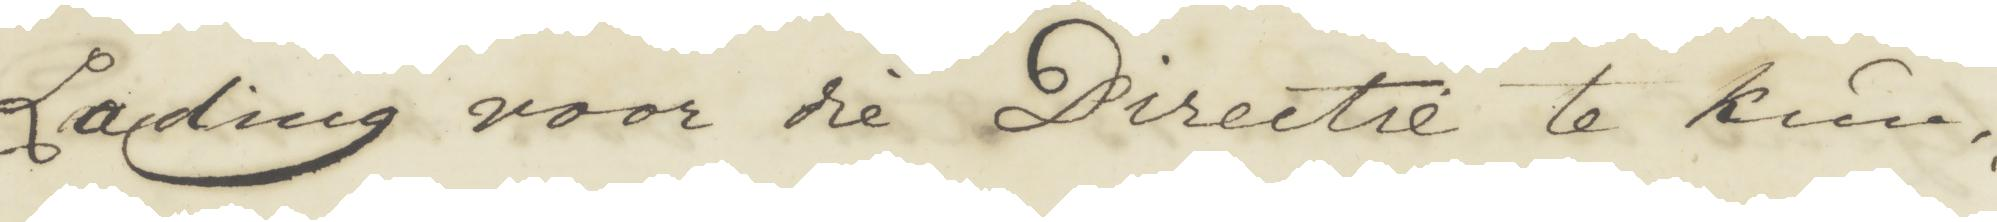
Lading voor die Directie te kun„
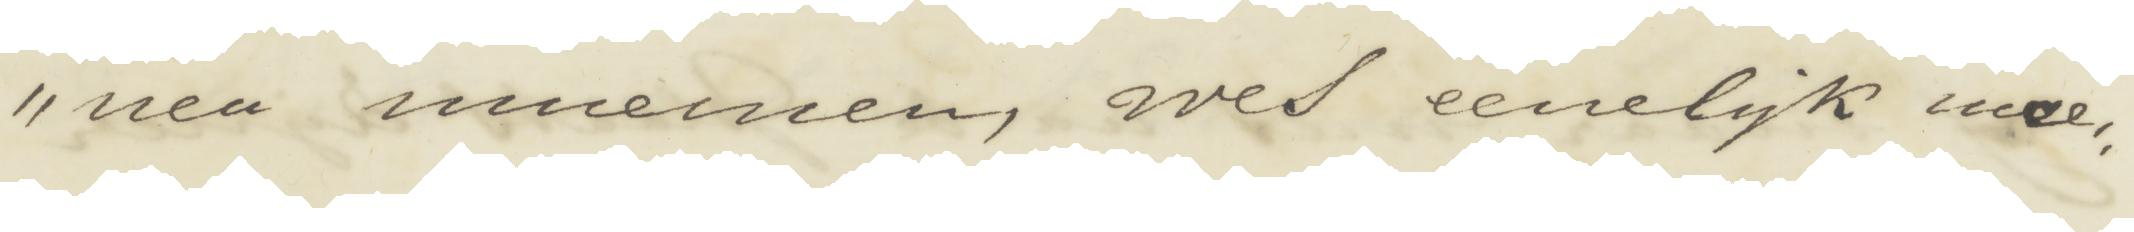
„nen innemen, wes eenelijk mee„
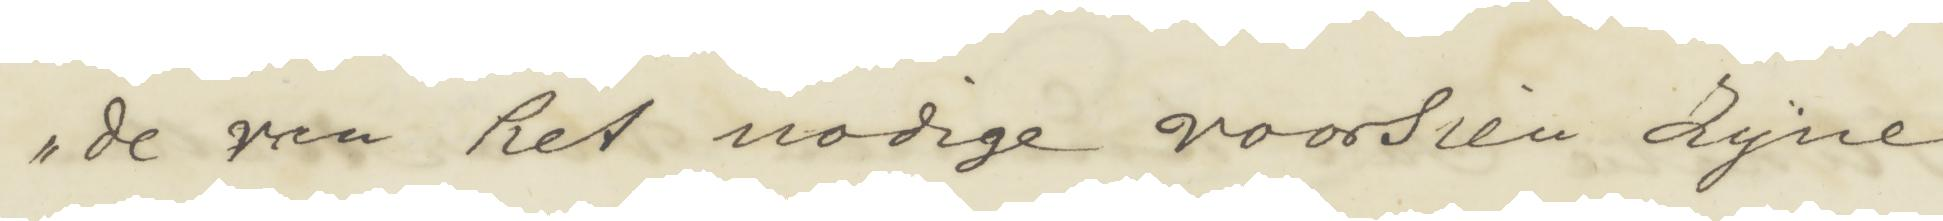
„de van het nodige voorsien zijne
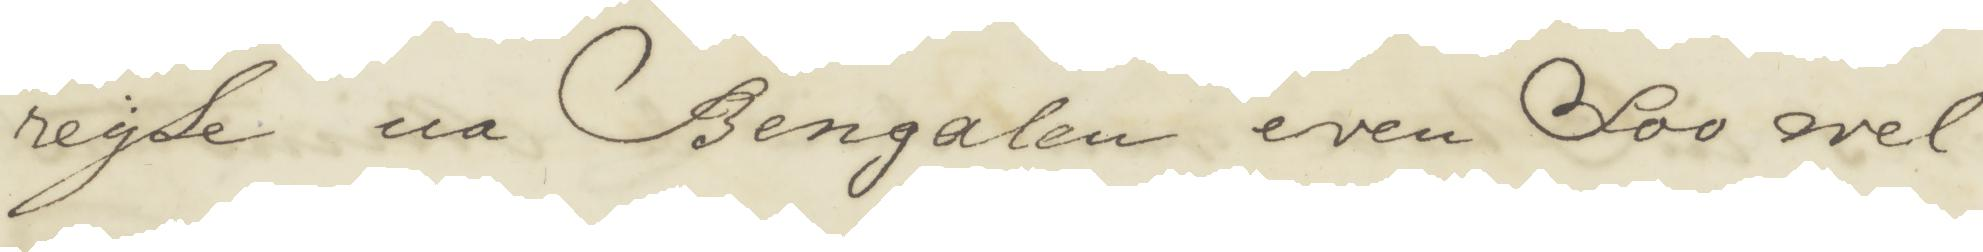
reijse na Bengalen even soo wel
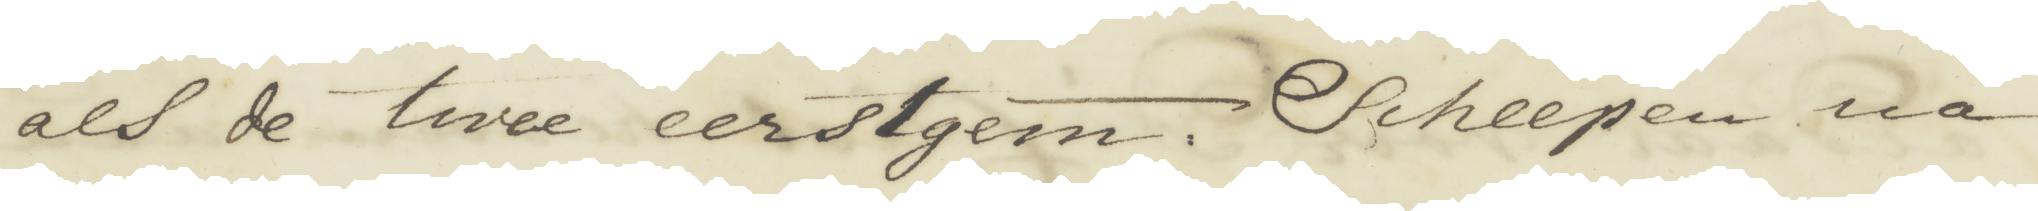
als de twee eerstgem: scheepen na
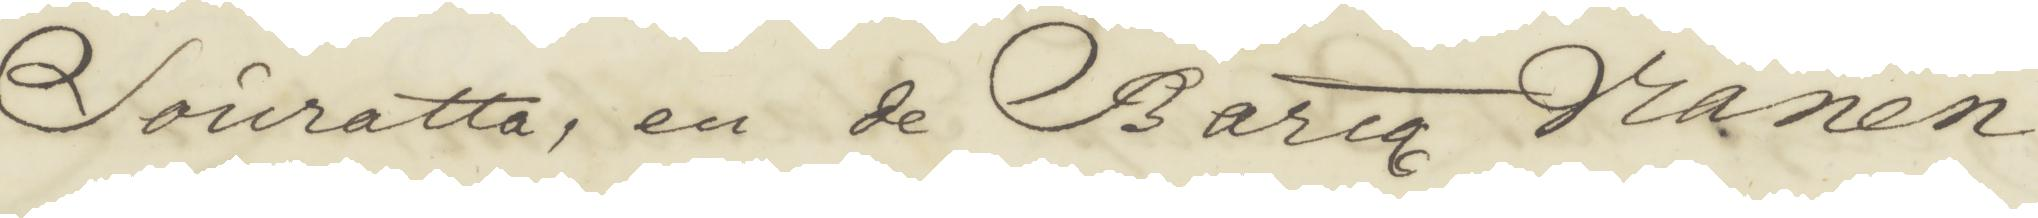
Souratta, en de Barcq Nanen
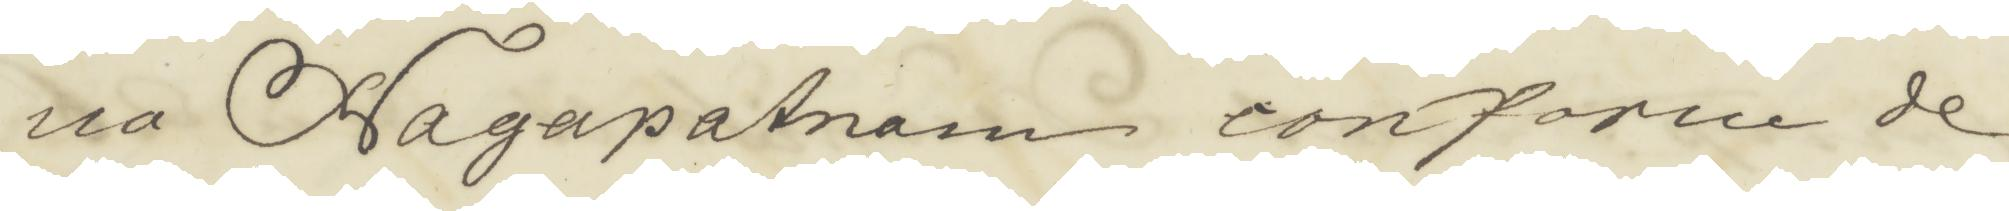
na Nagapatnam conform de
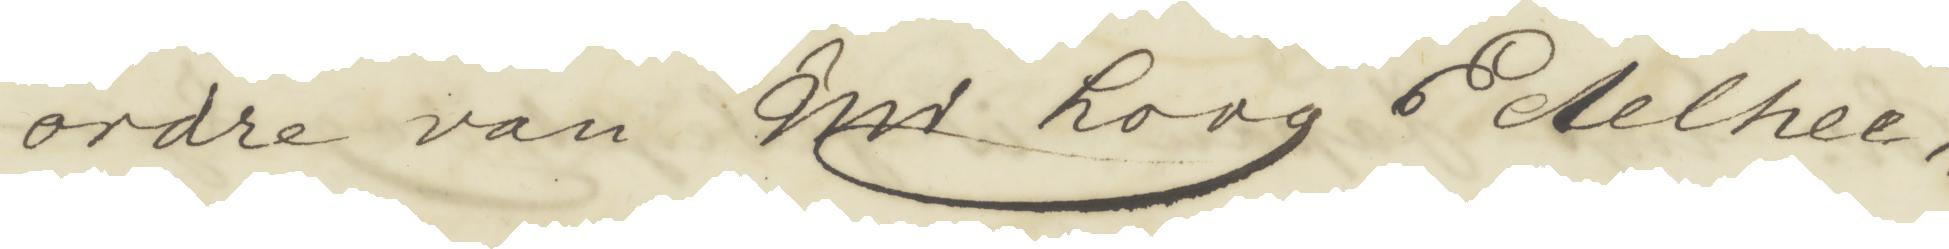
ordre van uw hoog Edelhee„
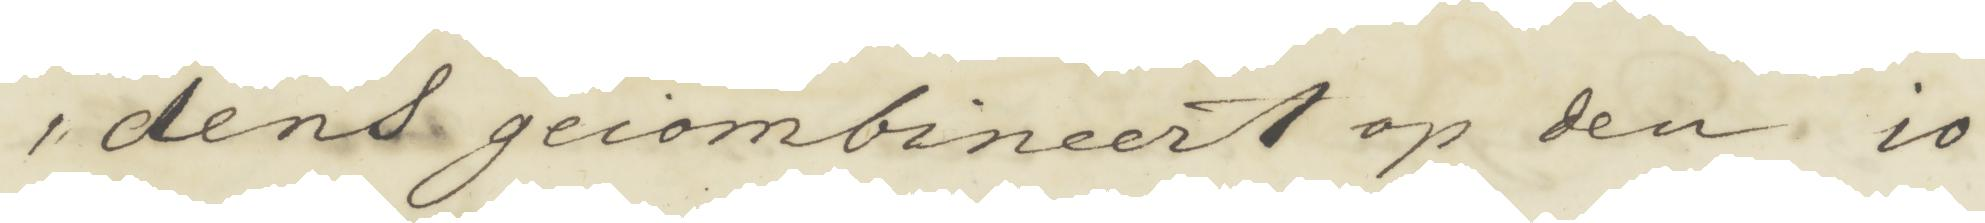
„dens gecombineert op den 10
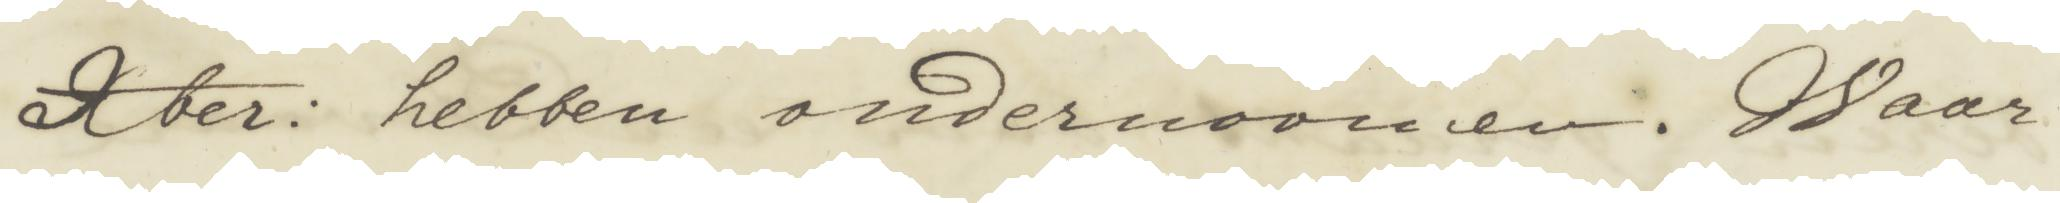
xber: hebben ondernoomen. Waar
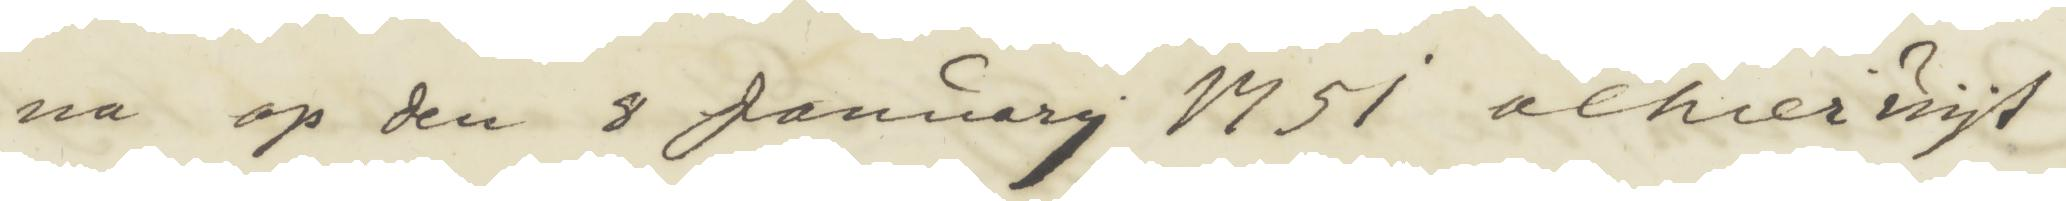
na op den 8 januarij 1751 alhier uijt
